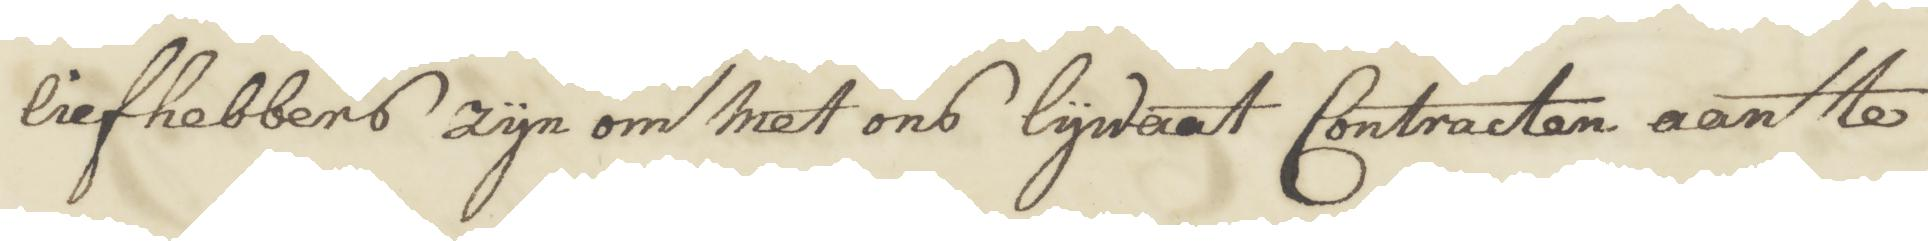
liefhebbers zijn om met ons lijwaat Contracten aan te
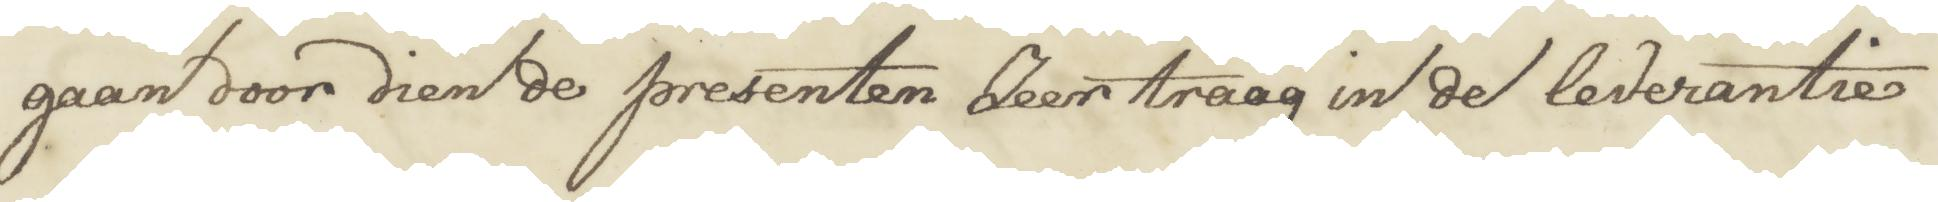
gaan door dien de presenten zeer traag in de leverantie
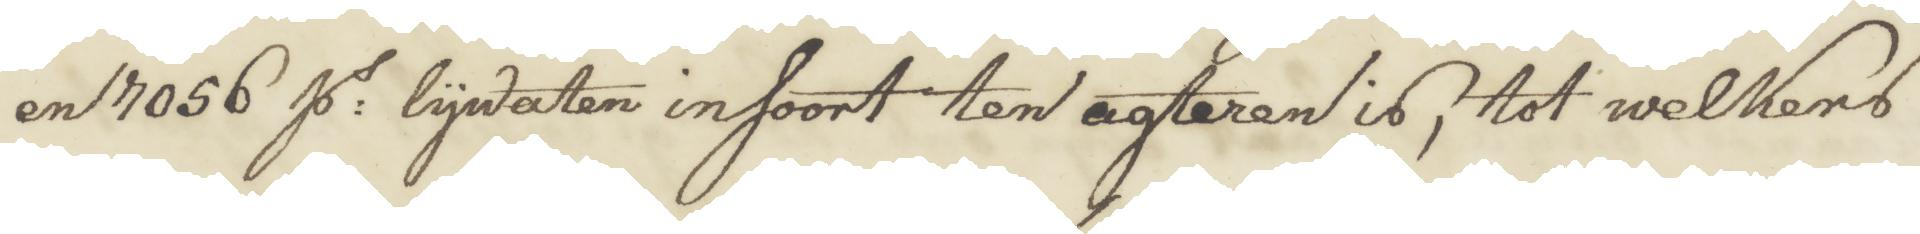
en 7056 p:s lijwaten insoort ten agteren is, tot welkers
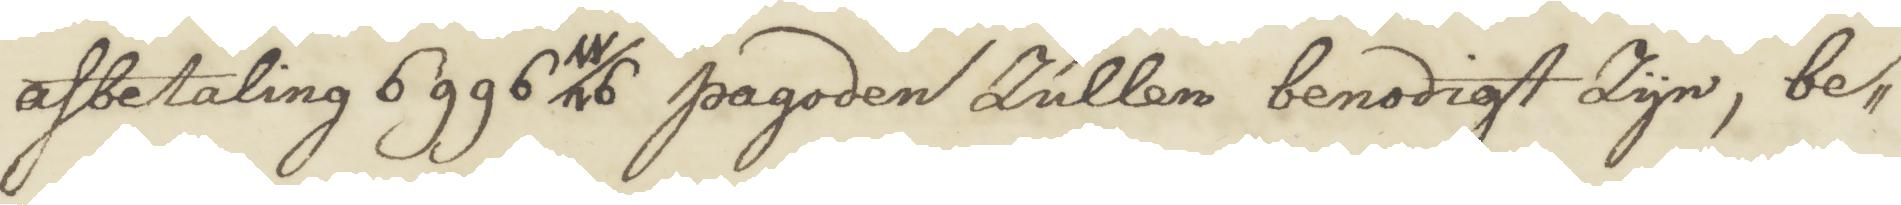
afbetaling 6996 11/16 pagoden zullen benodigt zijn, be„
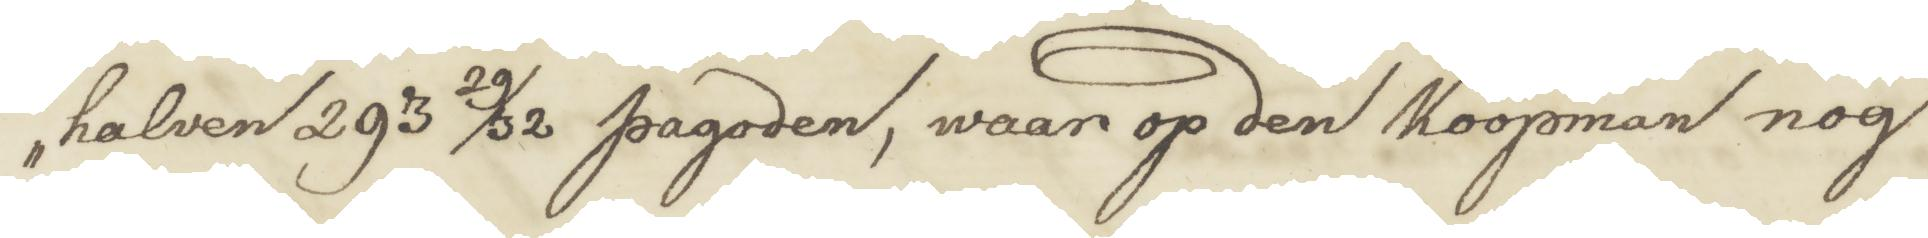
„halven 293 29/32 pagoden, waar op den koopman nog
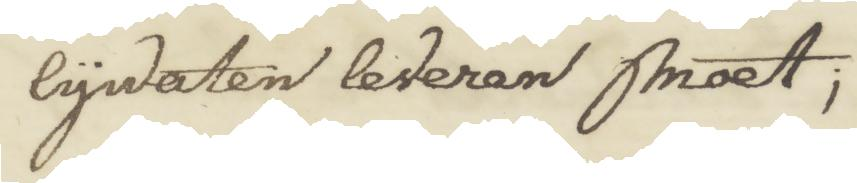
lijwaten leveren moet;
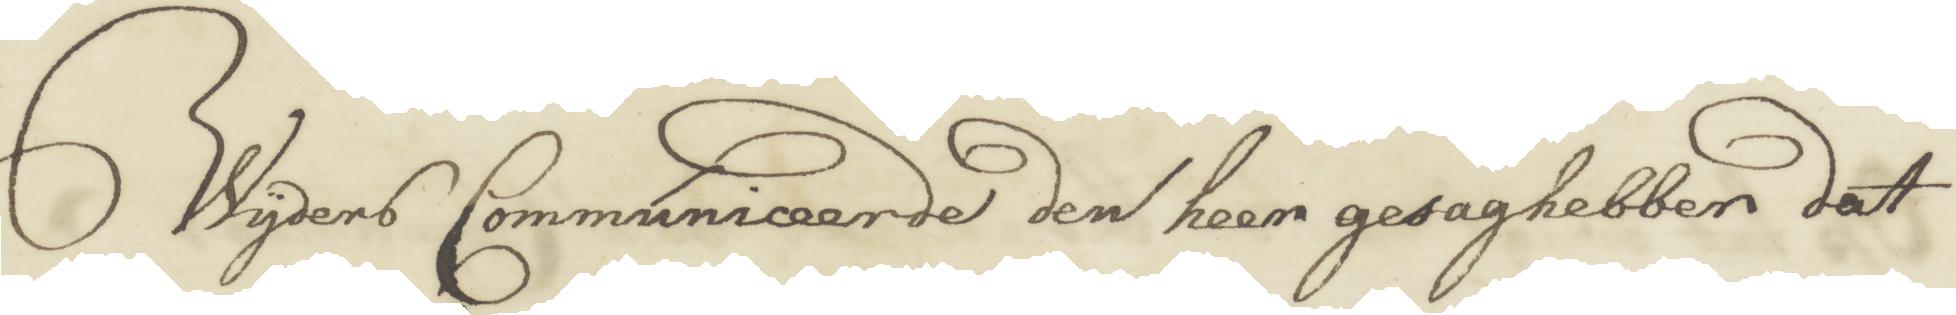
Wijders Communiceerde den heer gesaghebber dat
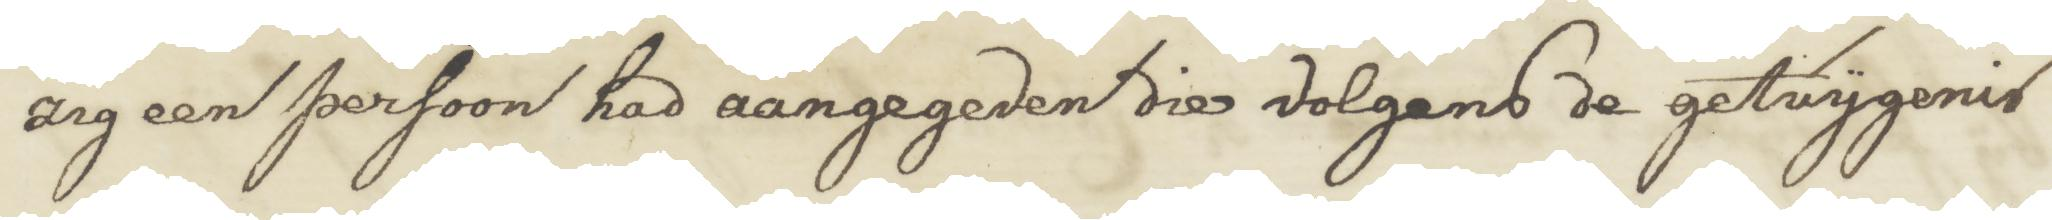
zig een persoon had aangegeven die volgens de getuijgenis
